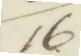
5/16
